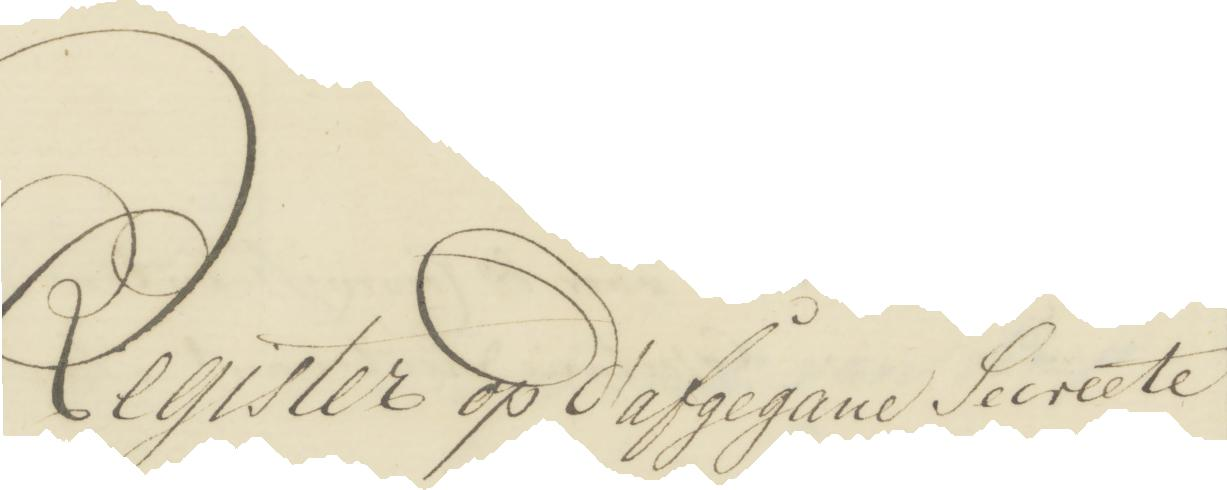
Register op d'afgegane Secreete
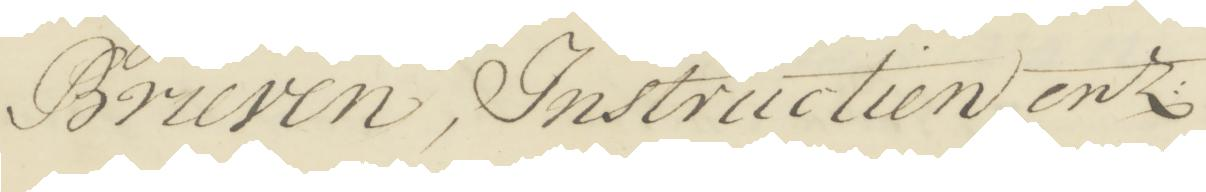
Brieven, Instructien enz:
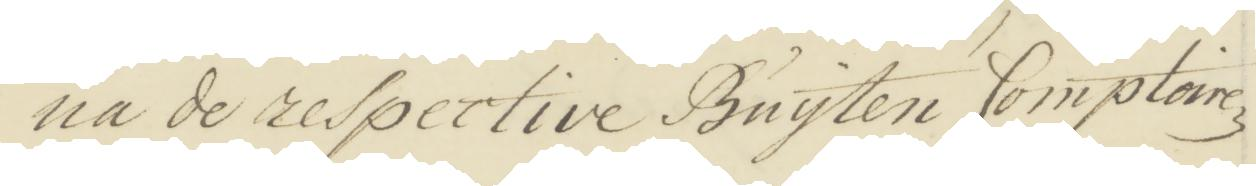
na de respective Buijten Comptoiren
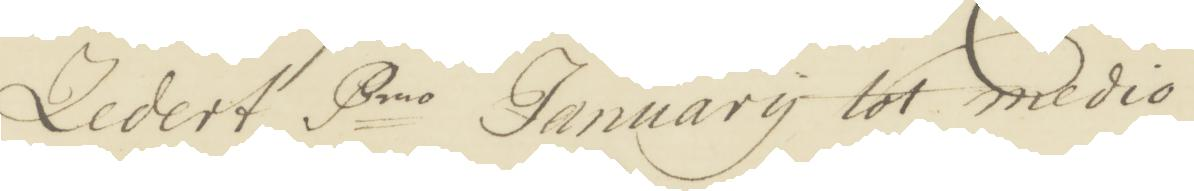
Zedert P=mo Januarij tot medio
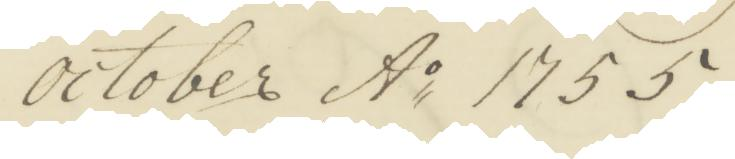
october A„o 1755
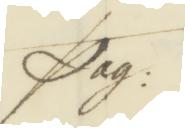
Pag:
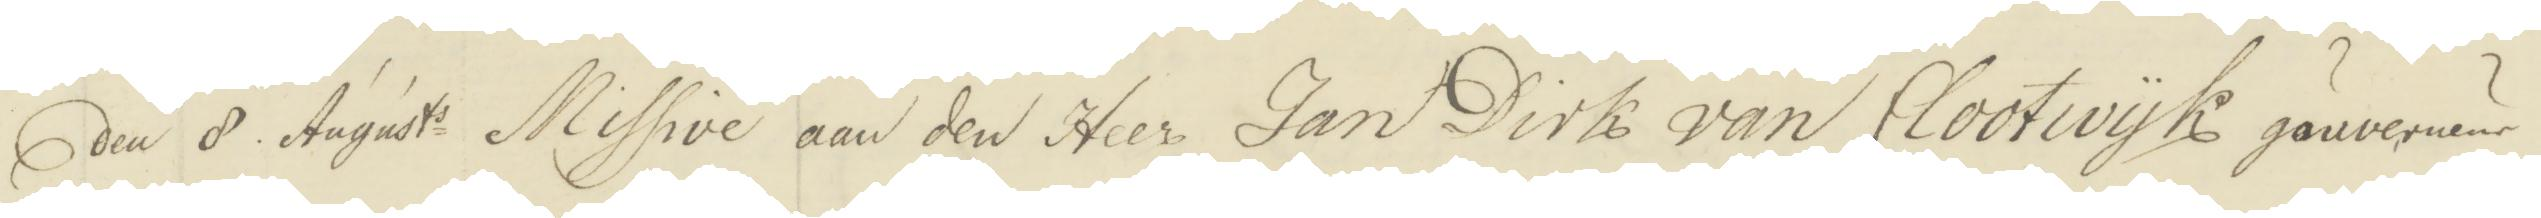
den 8 August=s Missive aan den Heer Jan Dirk van Clootwijk gouverneur
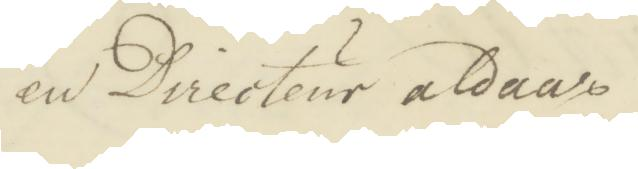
en Directeur aldaar
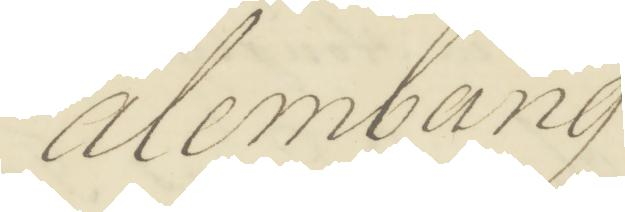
alembang
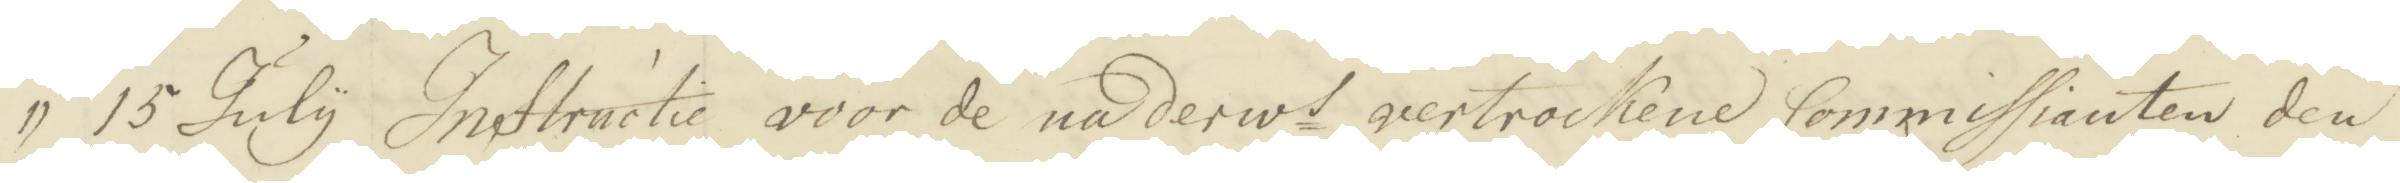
„ 15 Julij Instructie voor de na derw=s vertrockene Commissianten den
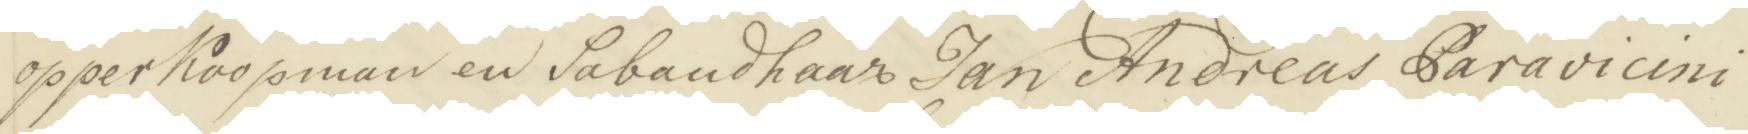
opperKoopman en Sabandhaar Jan Andreas Paravicini
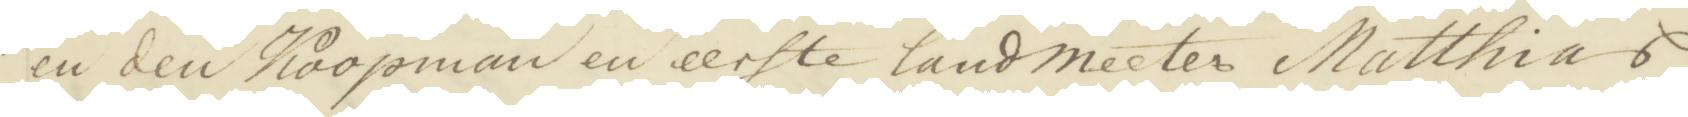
en den Koopman en eerste landmeeter Matthias
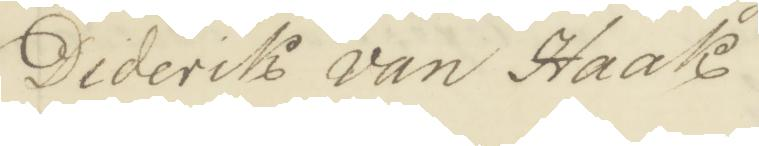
Diderik van Haak
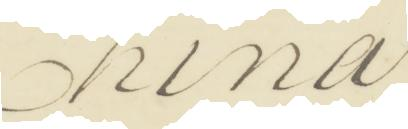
hina
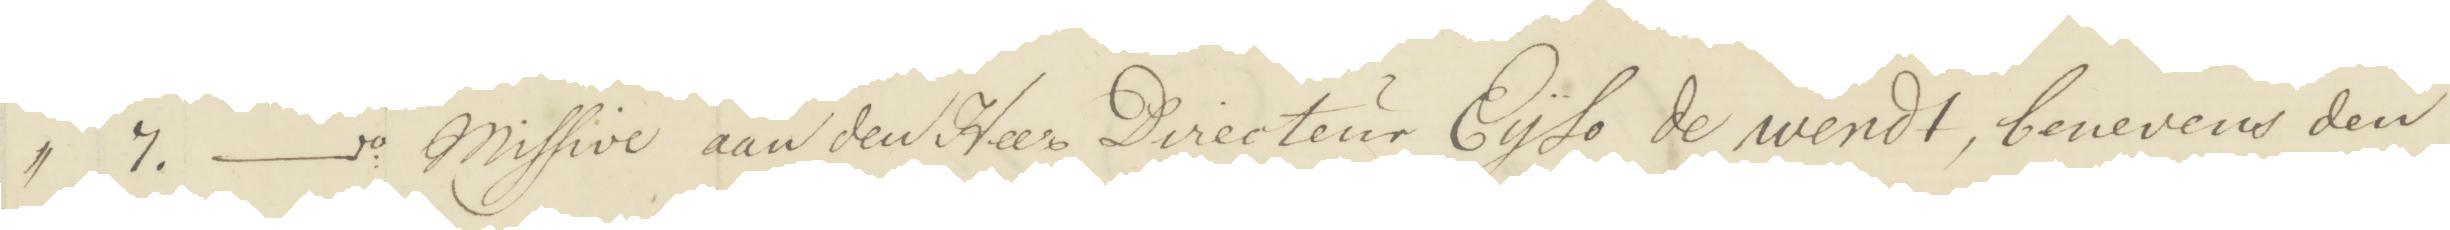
„ 7 _:o Missive aan den Heer Directeur Eijso de wendt, benevens den
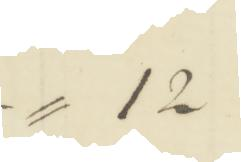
„ 12
